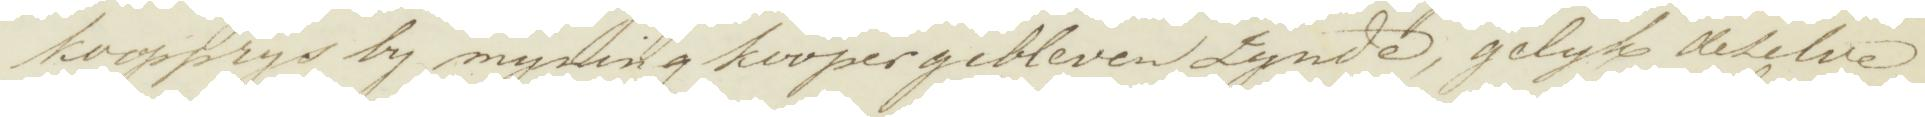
koopprys by myning kooper gebleven zynde, gelyk dezelve
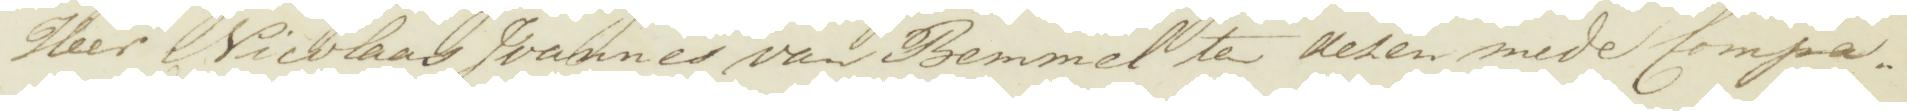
Heer Nicolaas Joannes van Bemmel te dezen mede Compa„
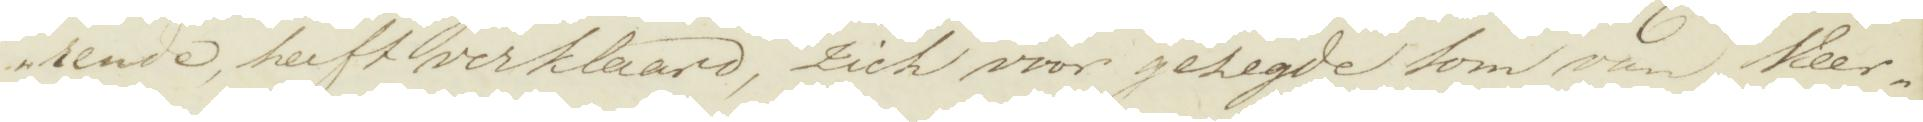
„rende, heeft verklaard, zich voor gezegde som van Veer„
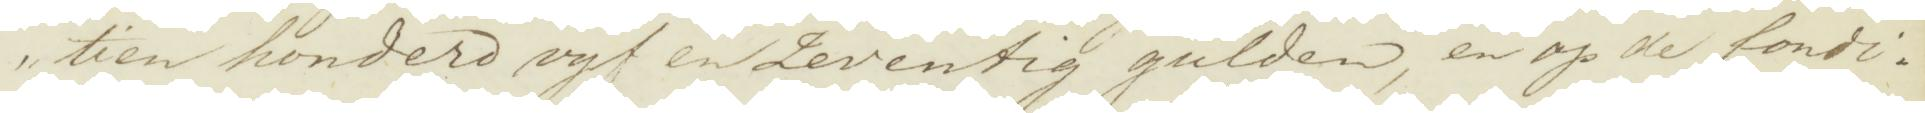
„tien honderd vyf en zeventig gulden, en op de condi„
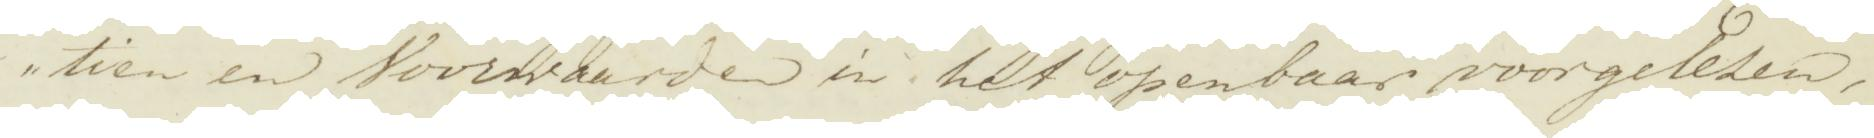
„tien en voorwaarden in het openbaar voorgelezen,
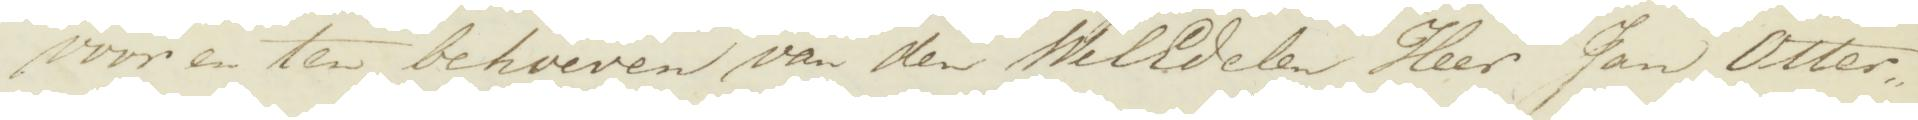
voor en ten behoeven van den WelEdelen Heer Jan Otter„
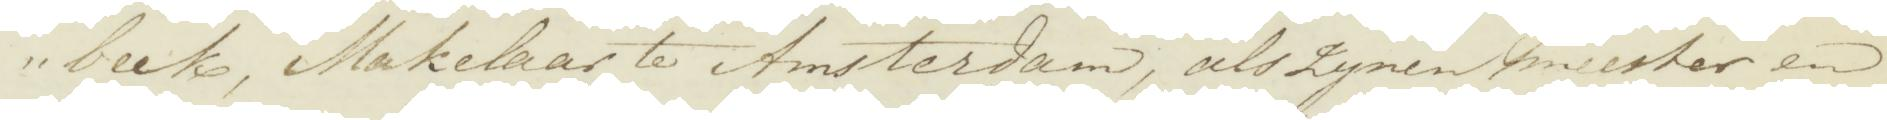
„beek, Makelaar te Amsterdam, als zynen meester en
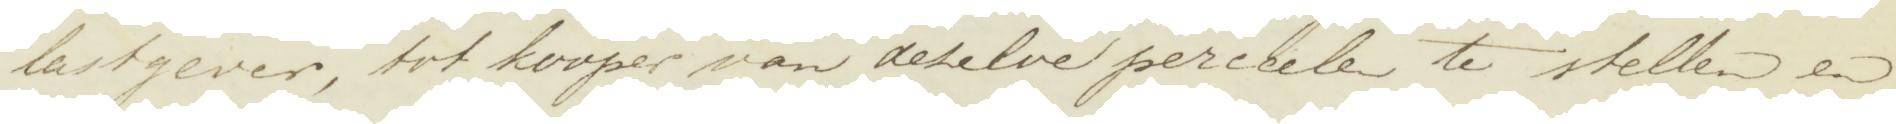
lastgever, tot kooper van dezelve perceelen te stellen en
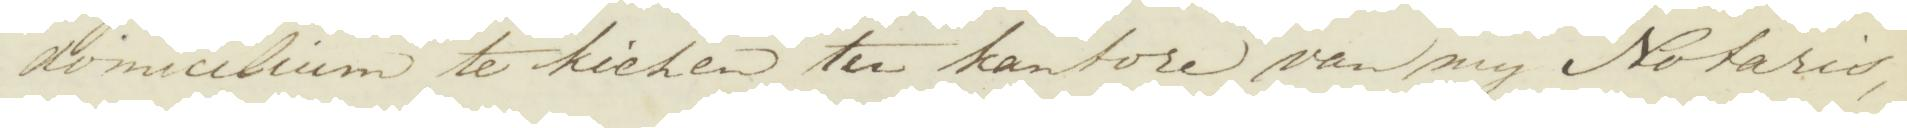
domicilium te kiezen ten kantore van my Notaris,
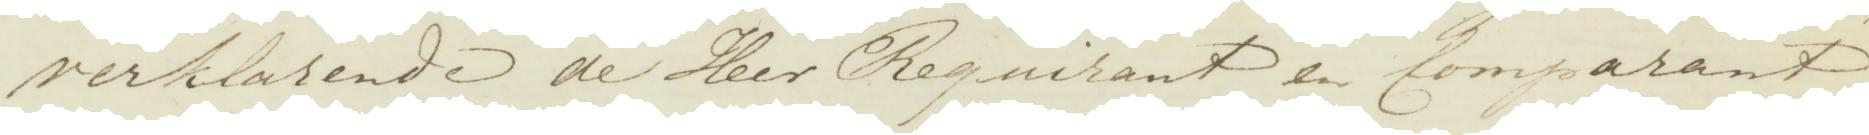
verklarende de Heer Requirant en Comparant
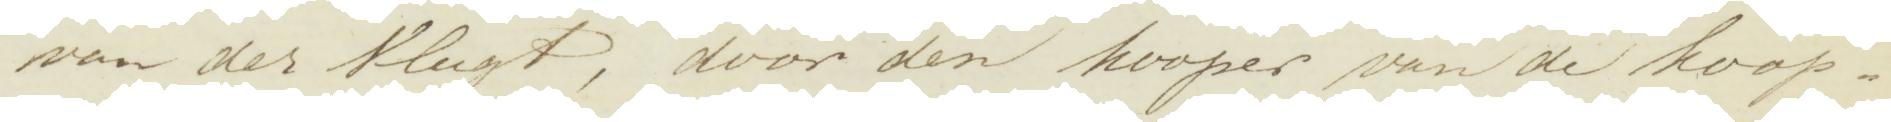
van der Vlugt, door den kooper van de koop„
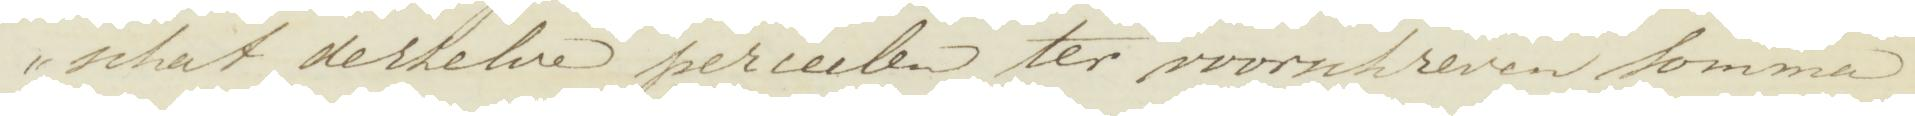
„schat derzelve perceelen ter voorschreven somma
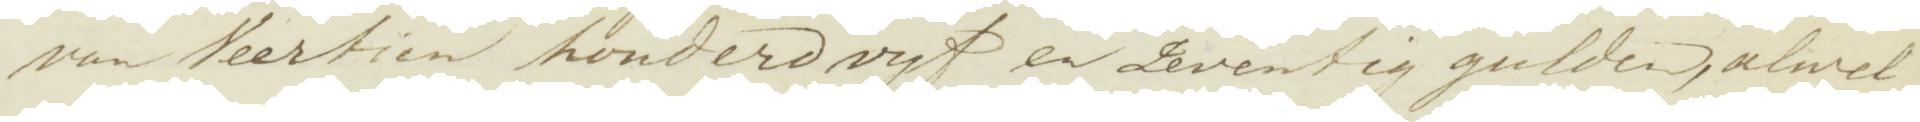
van Veertien honderd vyf en zeventig gulden, alwel
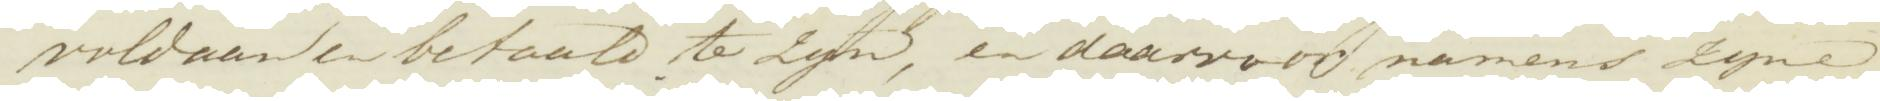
voldaan en betaald te zyn, en daarvoor namens zyne
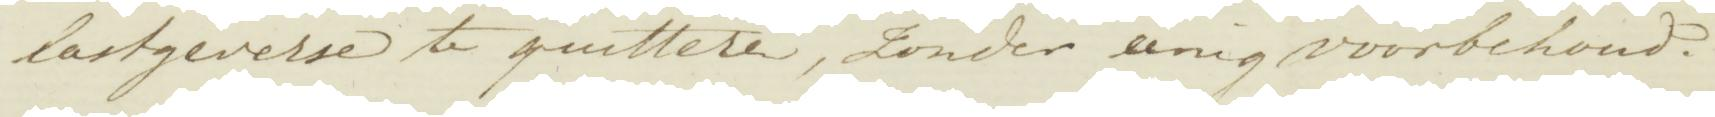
lastgeverse te quitteren, zonder eenig voorbehoud.
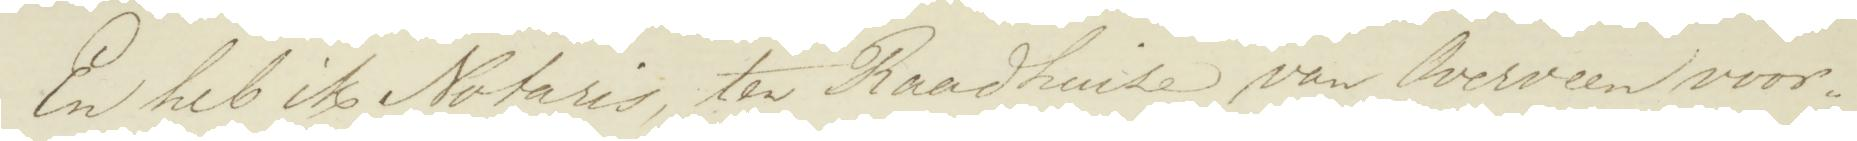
En heb ik Notaris, ten Raadhuize van Overveen voor„
